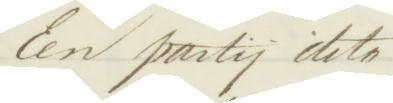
Een partij dito
